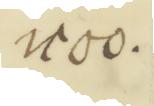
1500.
